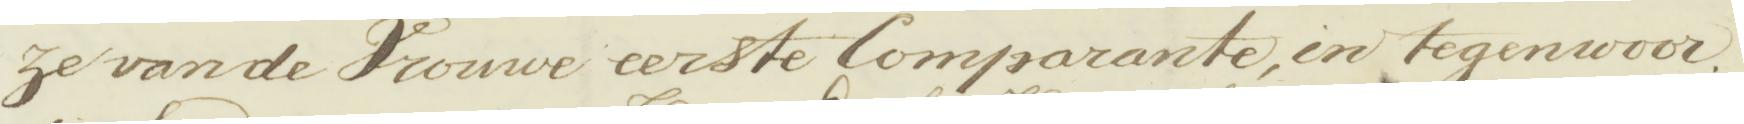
ze van de Vrouwe eerste Comparante, in tegenwoor„
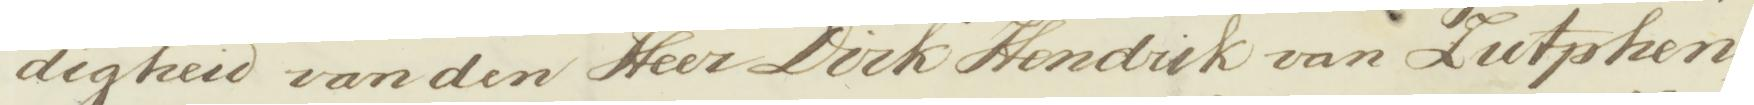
digheid van den Heer Dirk Hendrik van Zutphen,
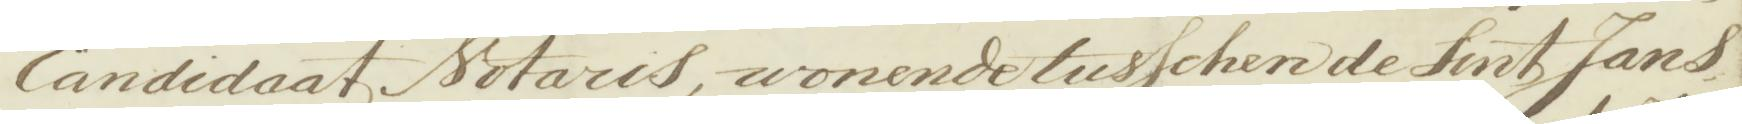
Candidaat Notaris, wonende tusschen de Sint Jans,
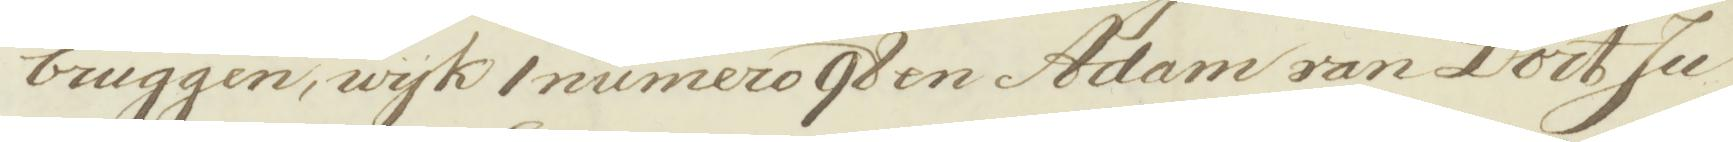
bruggen, wijk 1 numero 98 en Adam van Dort Ju
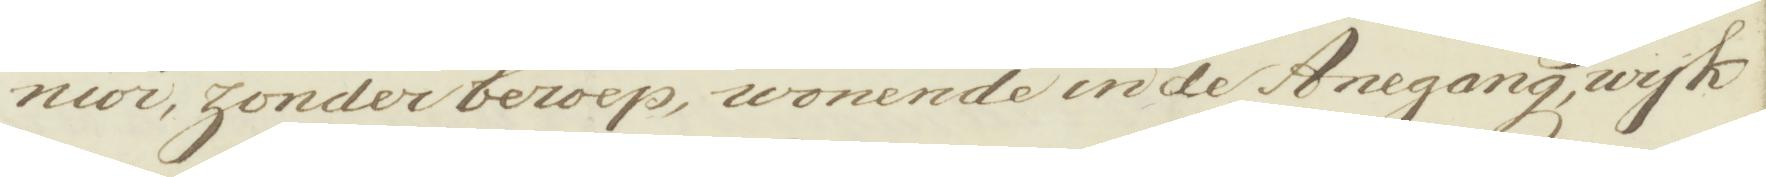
nior, zonder beroep, wonende in de Anegang, wijk
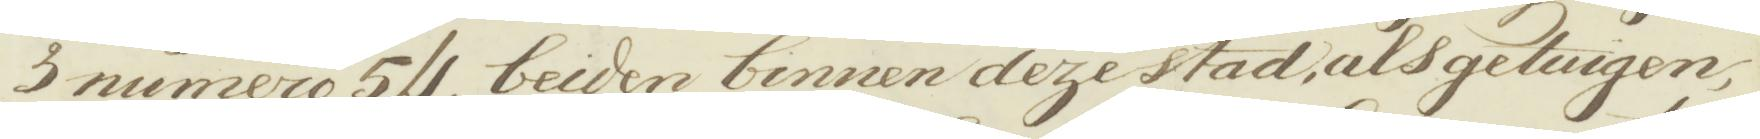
3 numero 54, beiden binnen deze stad, als getuigen,
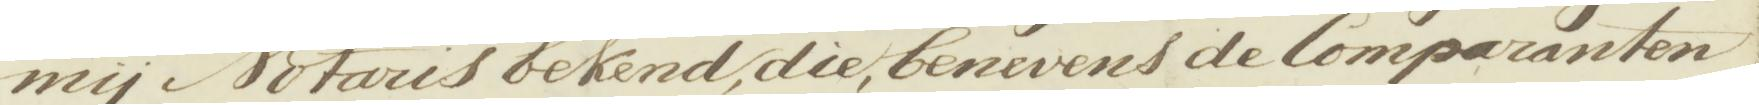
mij Notaris bekend, die, benevens de Comparanten
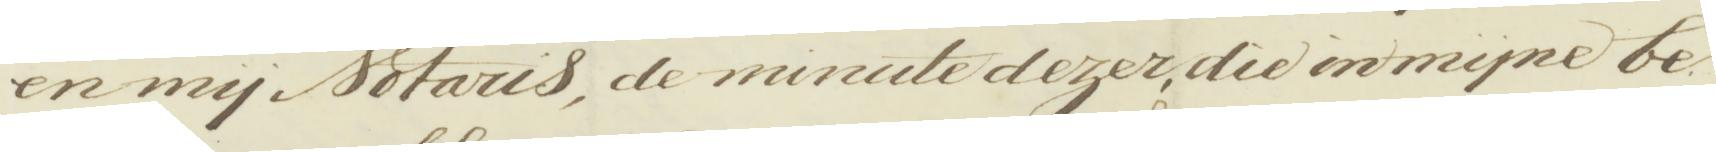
en mij Notaris, de minute dezer, die in mijne be.
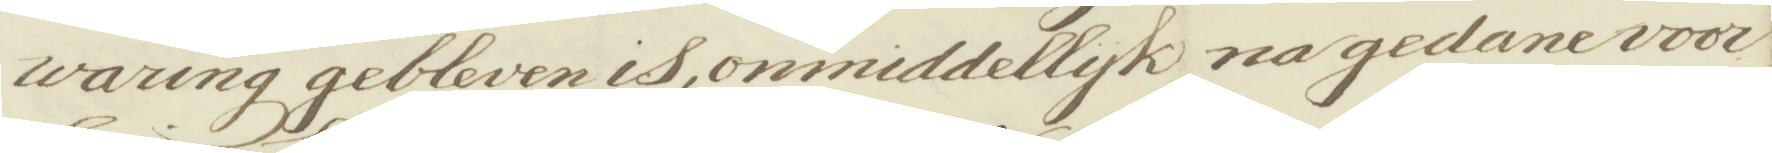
waring gebleven is, onmiddellijk na gedane voor
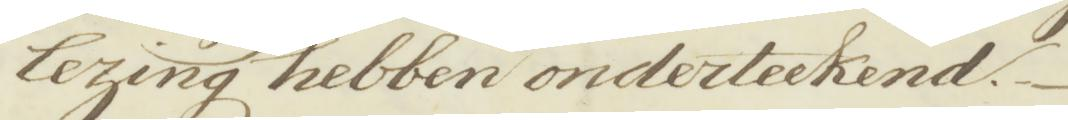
lezing hebben onderteekend.--
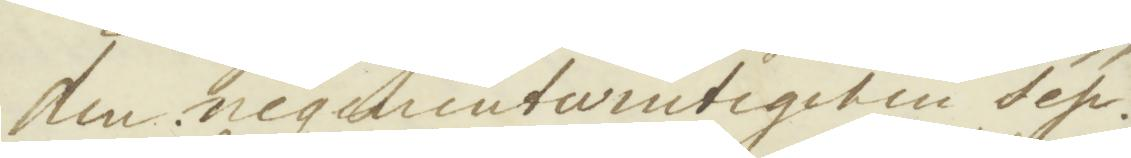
den negenentwintigsten Sep.
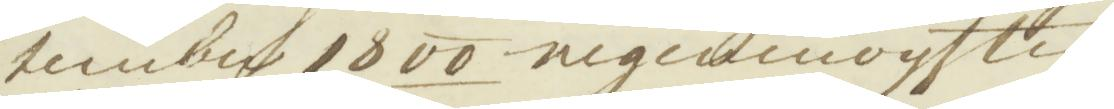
tember 1800 negenenvyftig
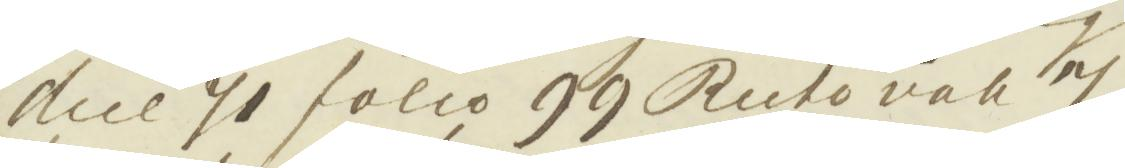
deel 71 folio 99 Recto vak 7.
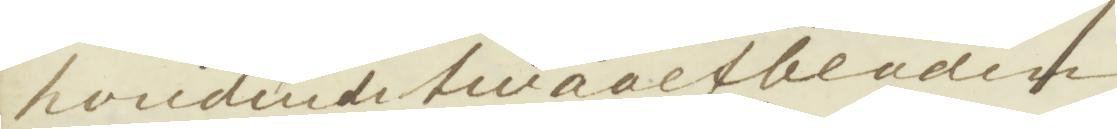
houdende twaalf bladen
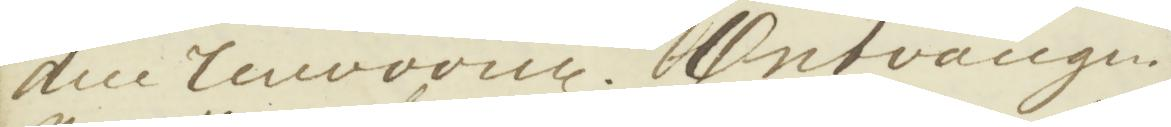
drie renvooien. Ontvangen
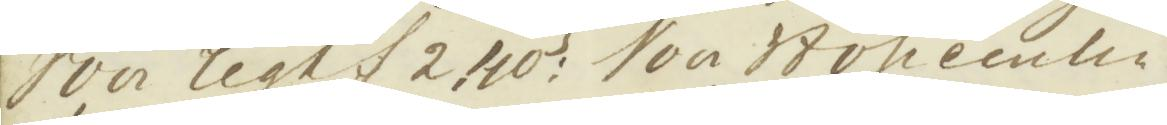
Voor regt ƒ 2,40: Voor 38 opcenten
